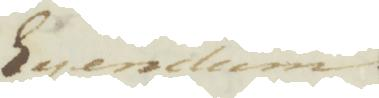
Egendam
